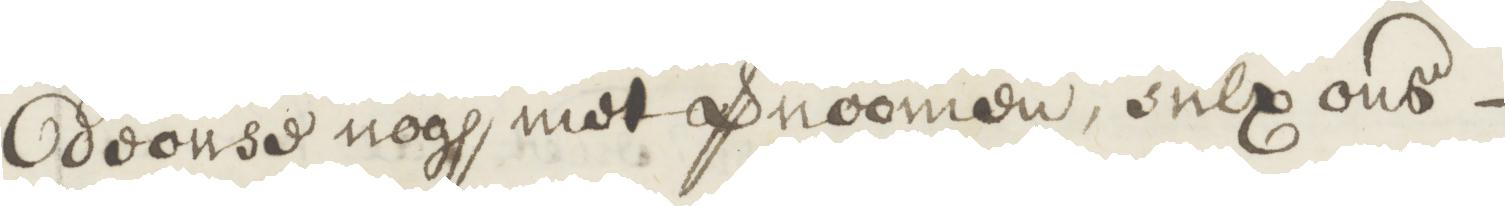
de onse nogh niet vernoomen, sulx ons —
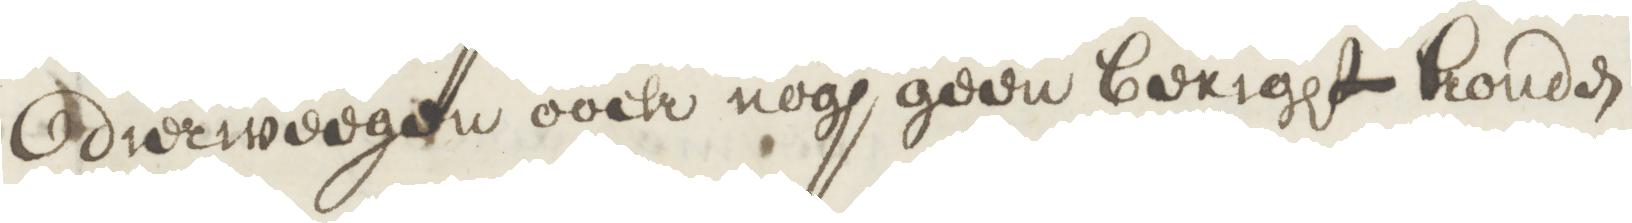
dierweegen oock nogh geen beright konden
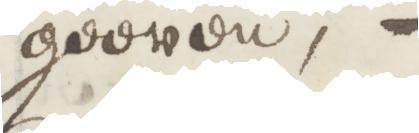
geeven; -
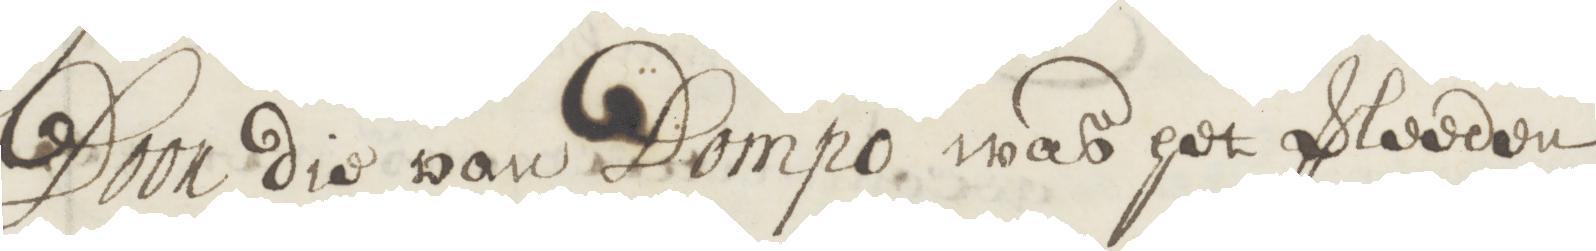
Door die van Dompo, was het verleeden
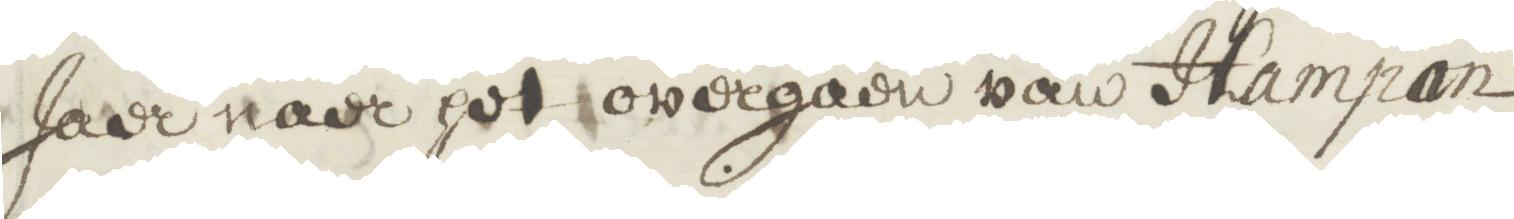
Jaer naer het overgaen van Hampan
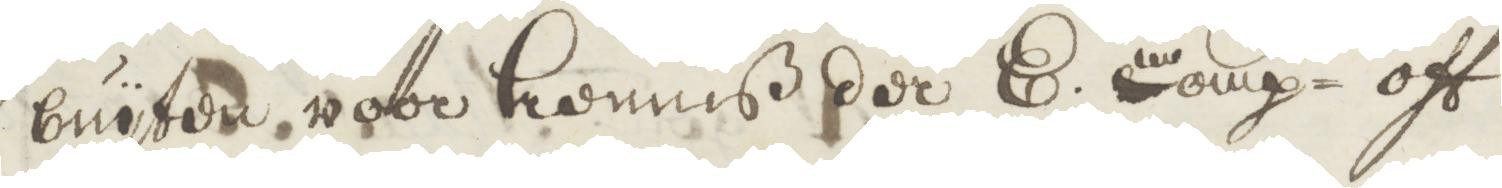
buijten voor kennis der E. Comp=e off
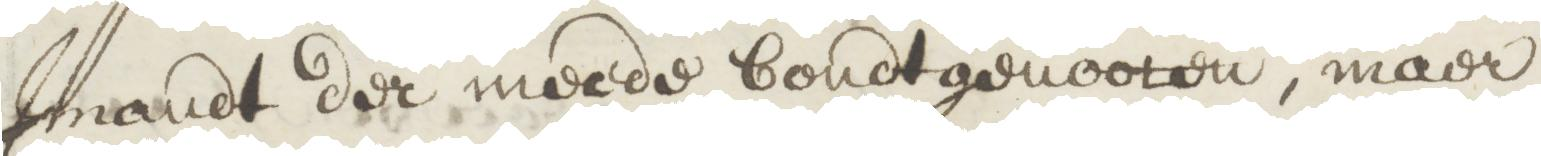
Jmandt der meede bondtgenooten, maer
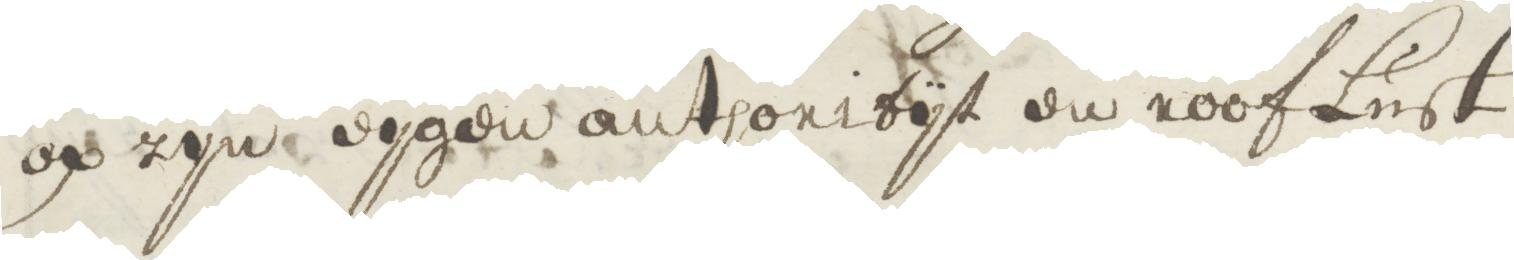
op zijn eijgen authoritijt en roof Lust
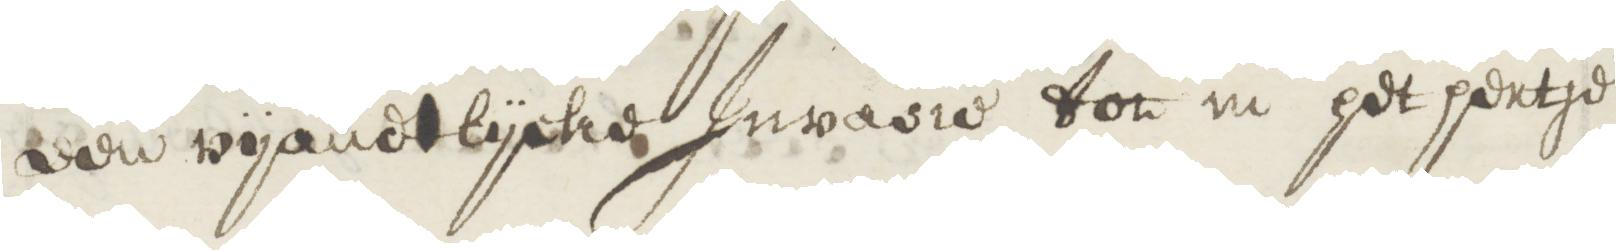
een vijandtlijcke Jnvasie tot in het hertje
